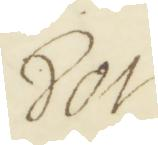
801
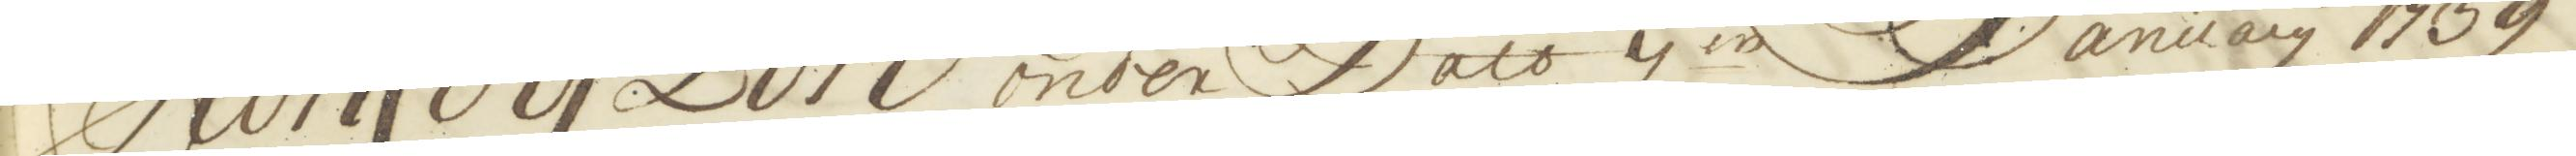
Van Ceijlon onder Dato 7=en Ianuarij 1739
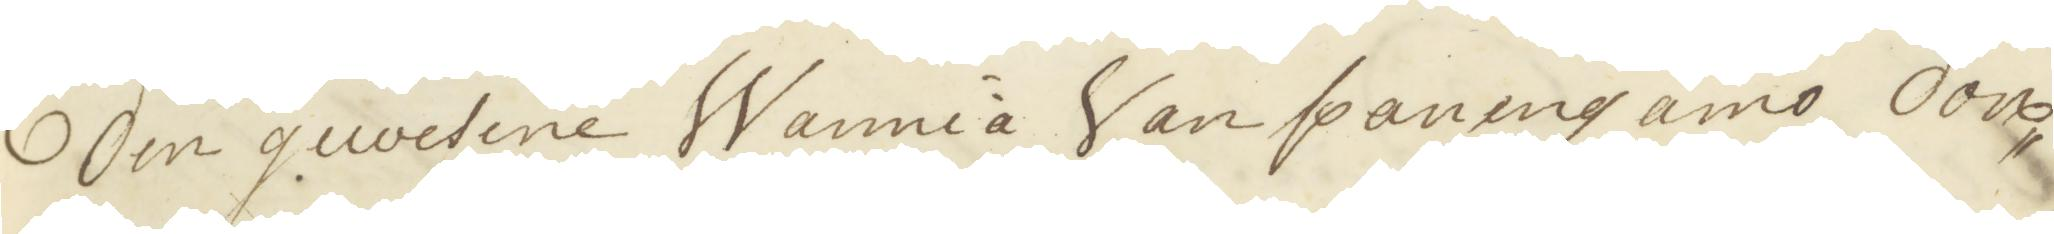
den gewesene Wannia Van panengamo don„
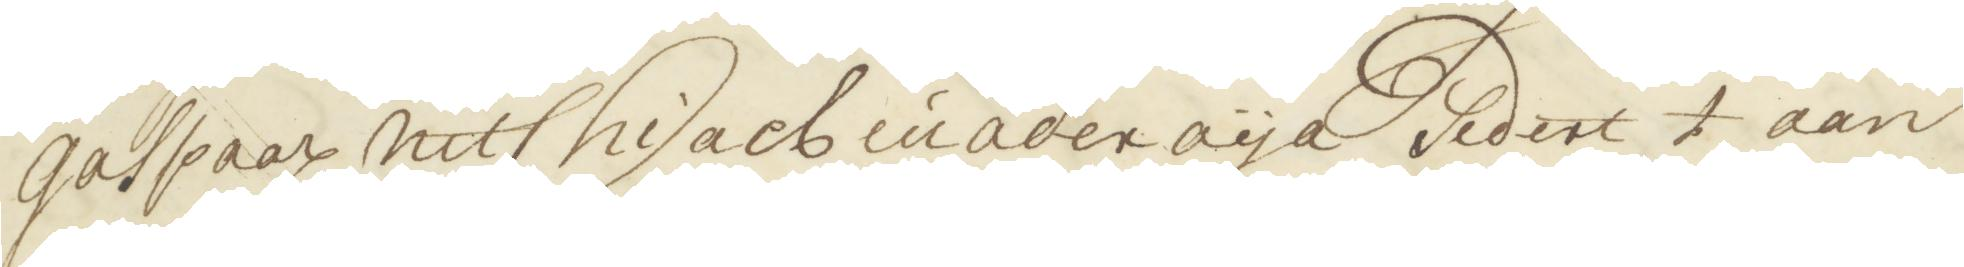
gaspaar netchiaeb eu ader aija sedert t aan
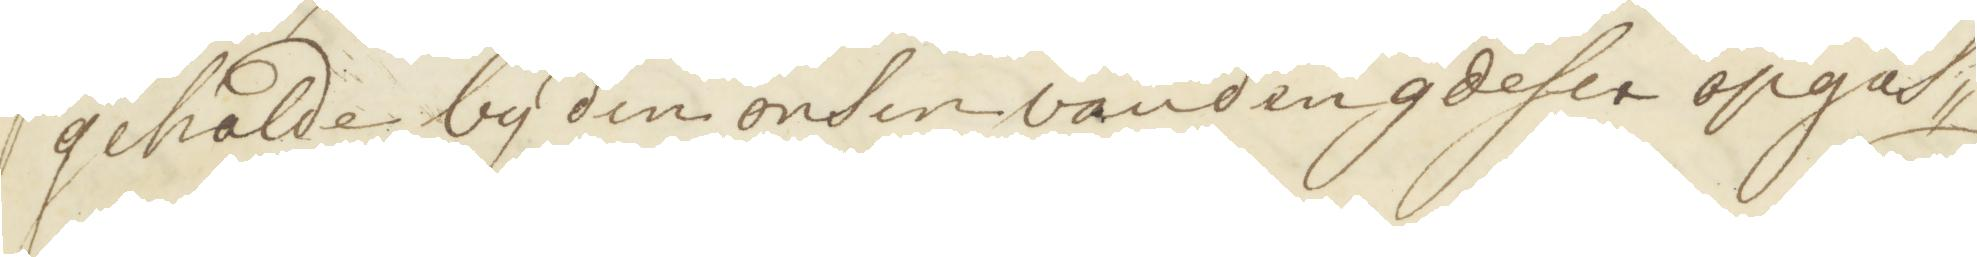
gehalde by den onsen vanden 9 deser opgis„
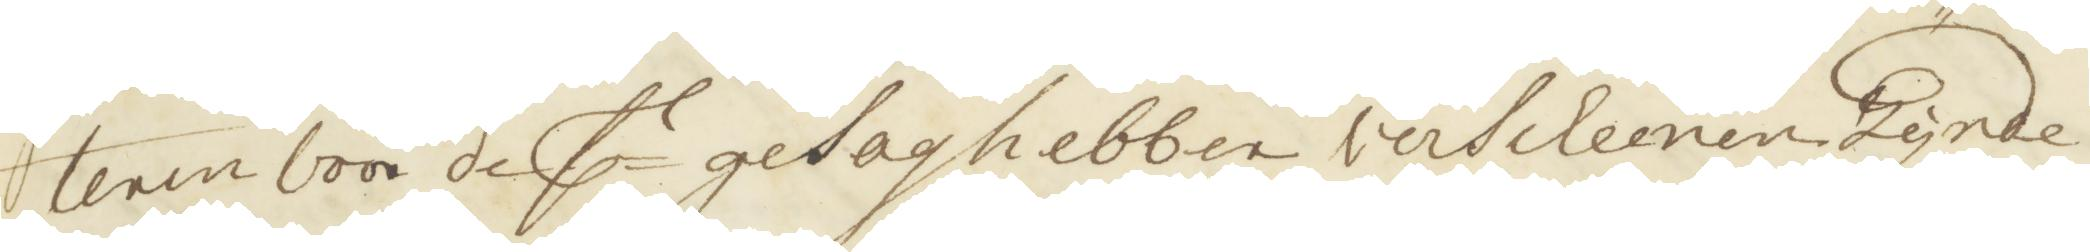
teren voor de p=l gesaghebber verscheenen zijnde
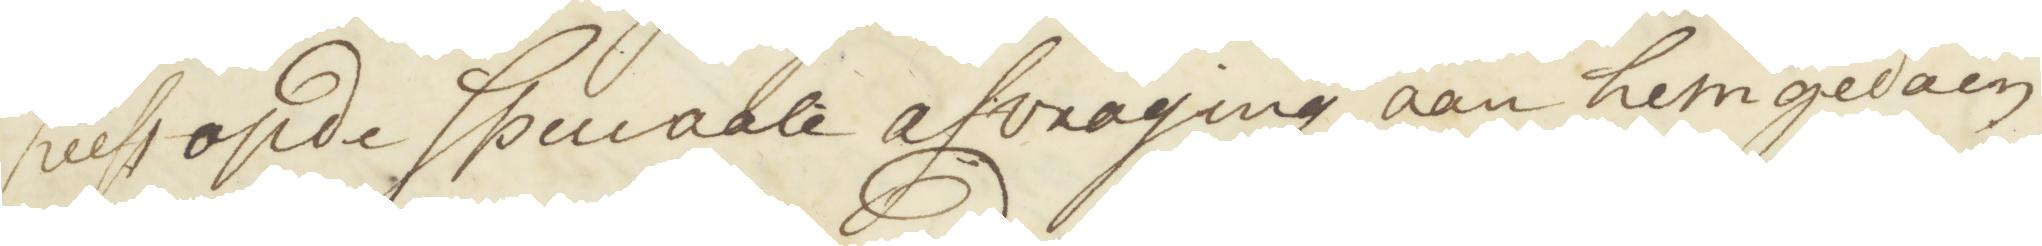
heeft opde spenaale afvraging aan hem gedaen
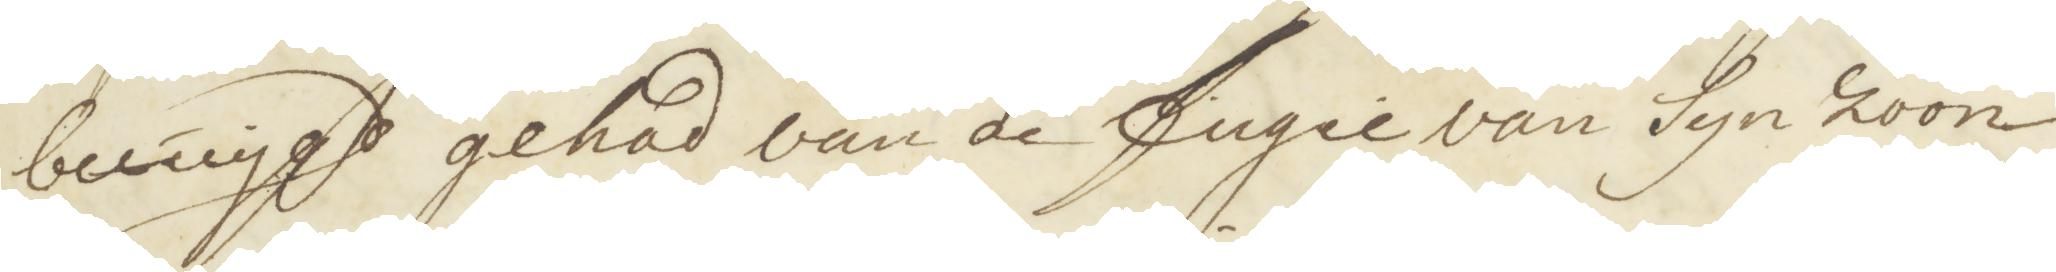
betuijgd gehad van de fugie van syn zoon
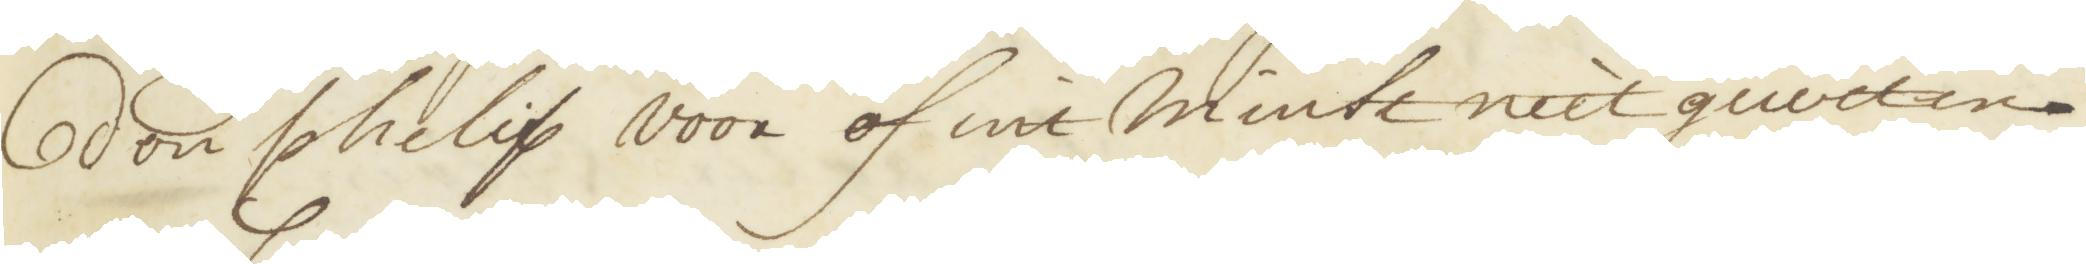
don Philip voor of in't minst niet geweten
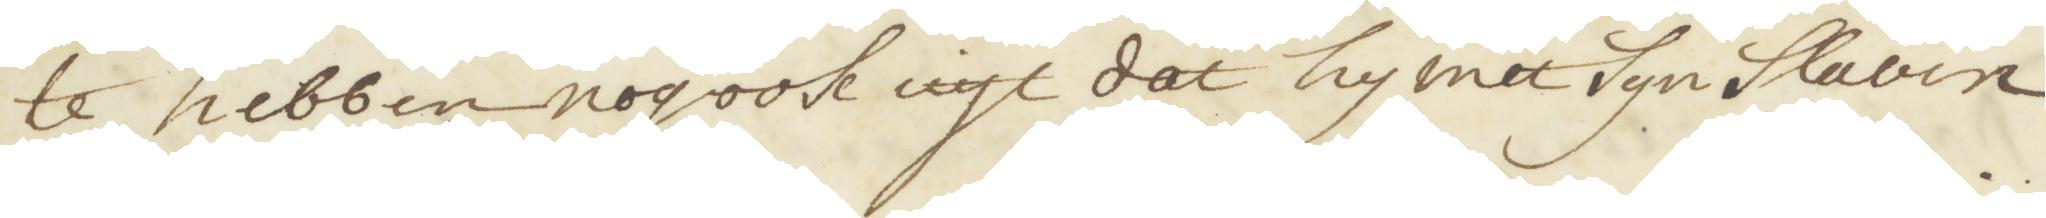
te hebben nog ook uijt dat hy met syn slavin
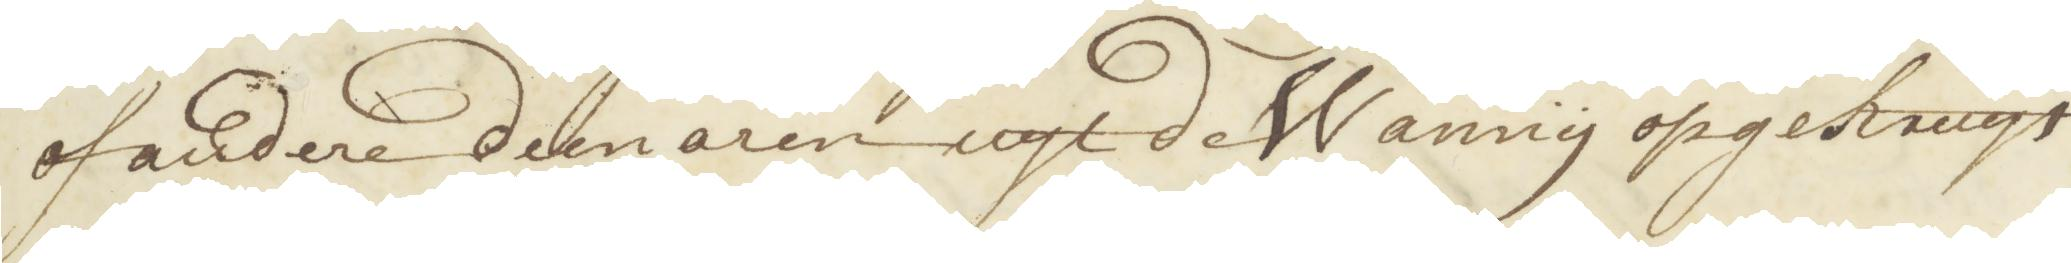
of andere dienaren uyt de Wannij opgekruijt
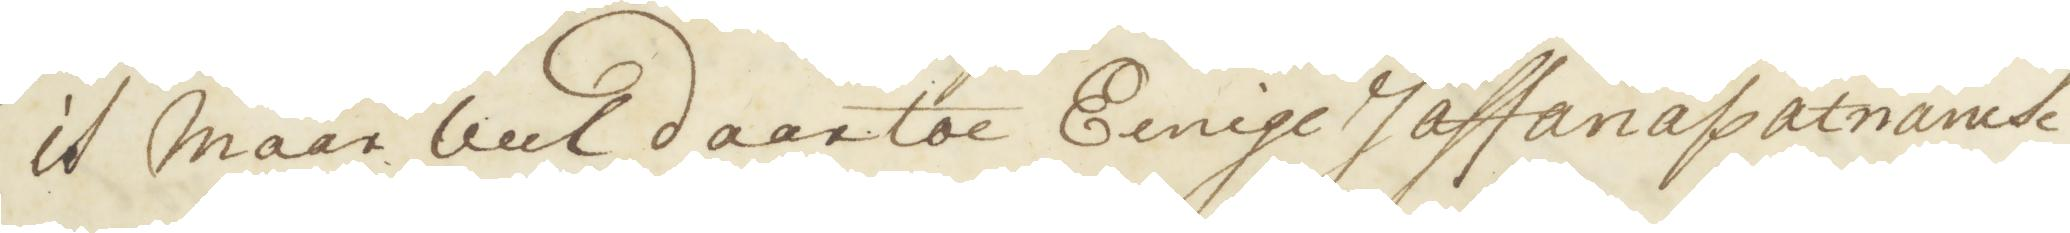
is Maar veel daar toe Eenige Jaffanapatnamse
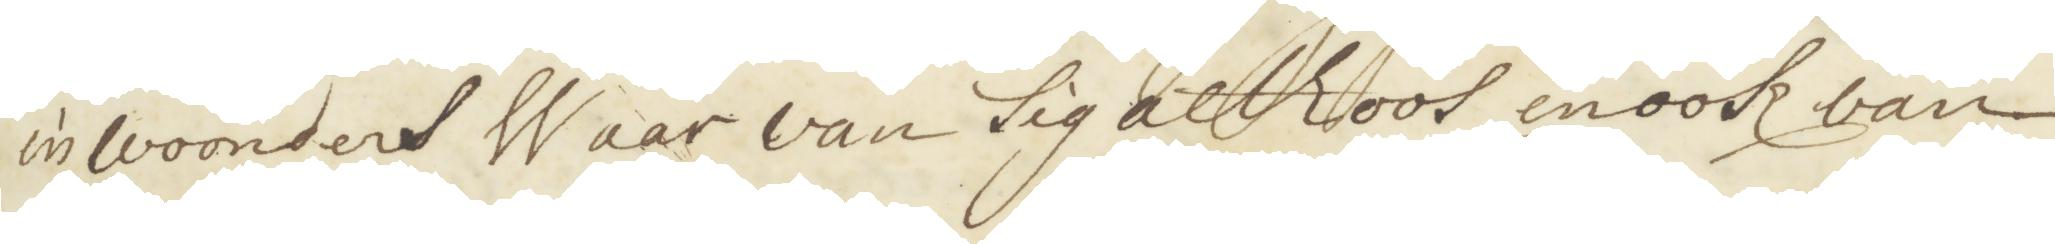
in woonders Waar van sig althoos enook van
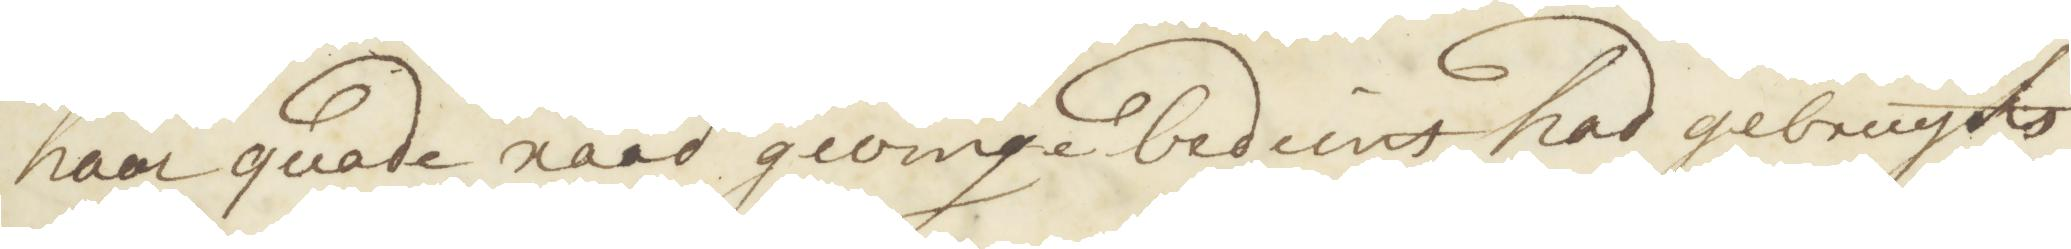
haar quade raad gevinge bedient had gebruykt
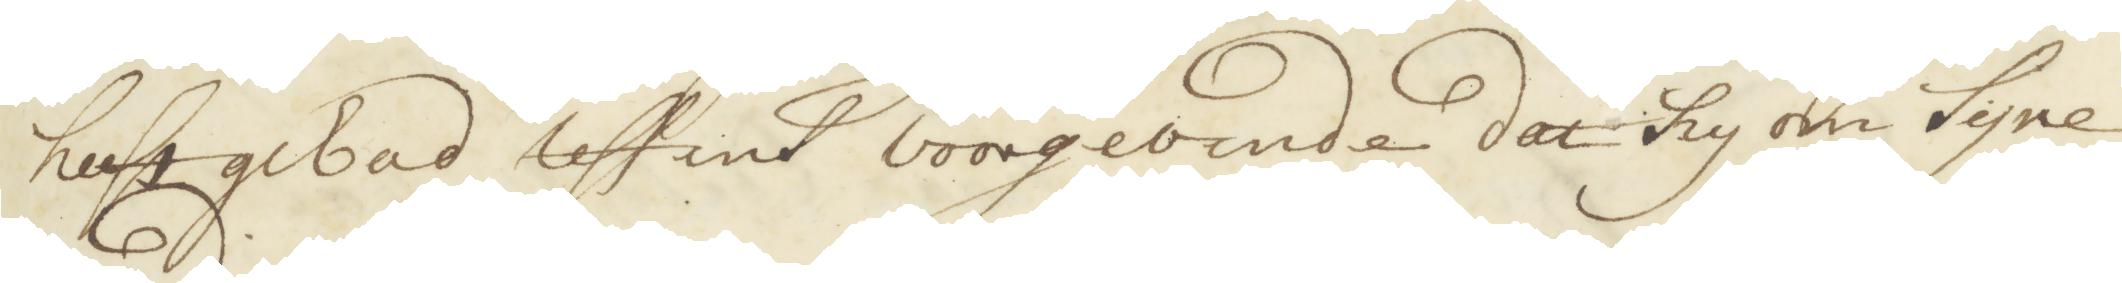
heeft gehad teffens voorgevende dat hy om sijne
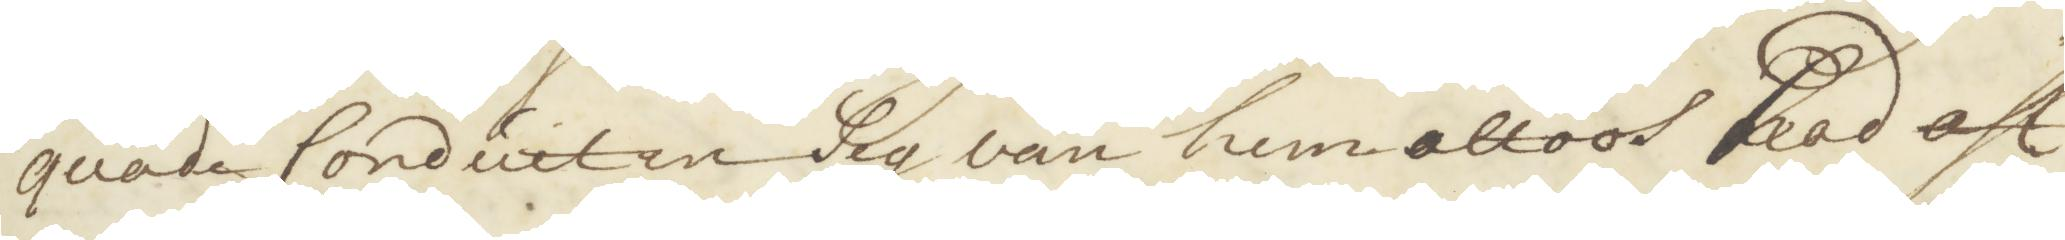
quade Conduiten seg van hem altoos had aff
